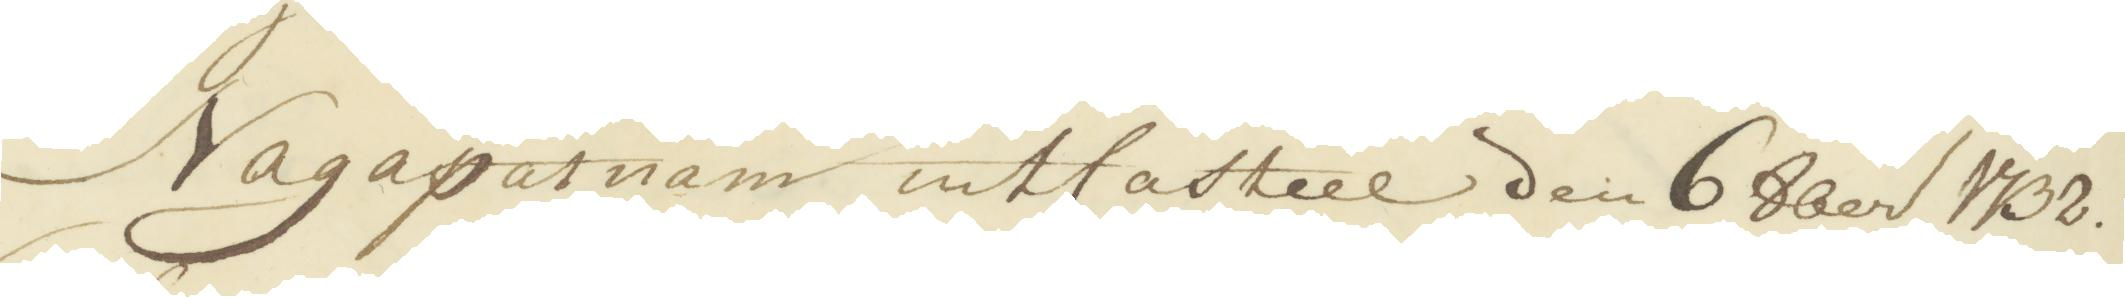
Nagapatnam int Casteel den 6 8ber 1732.
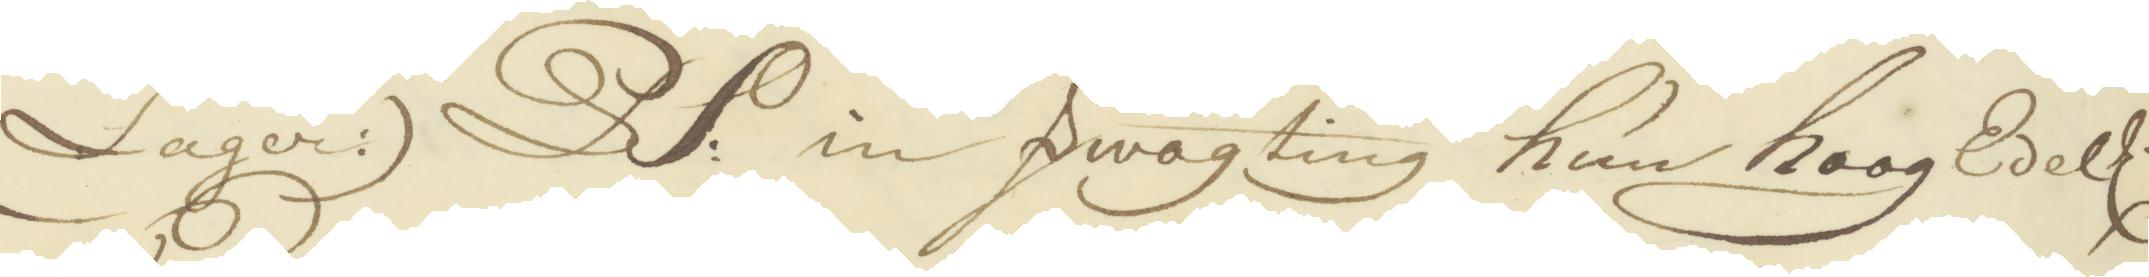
Lager:) PS: in verwagting hun hoog Edelhs
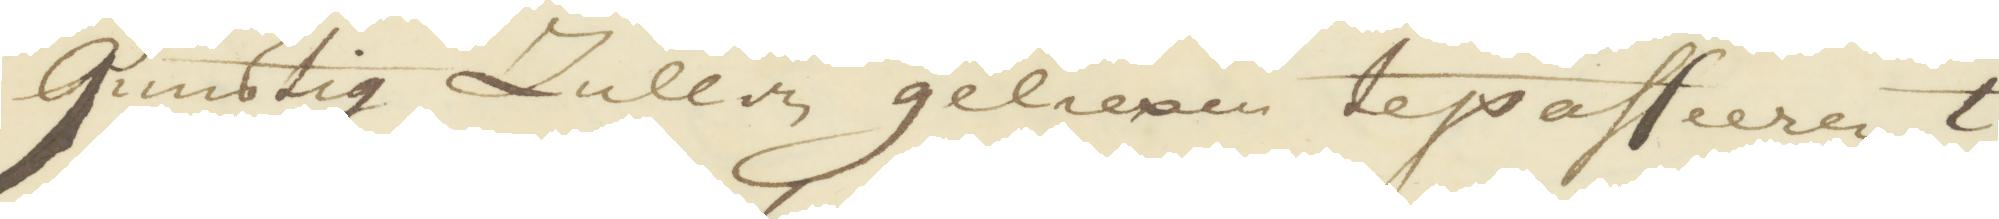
gunstig zullen gelieven te passeeren t
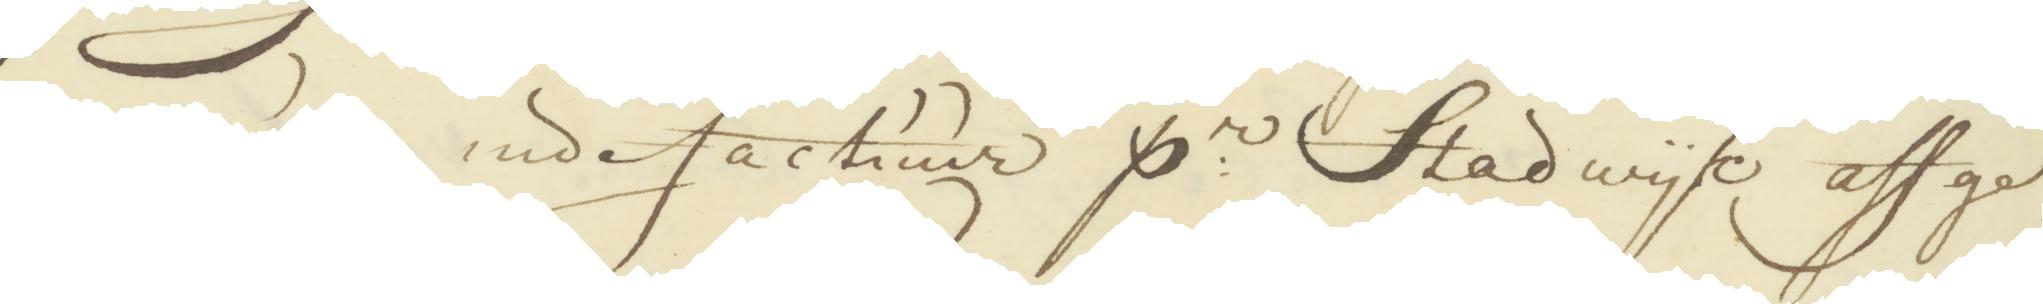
erreur inde factuur p:r Stad wijk affge
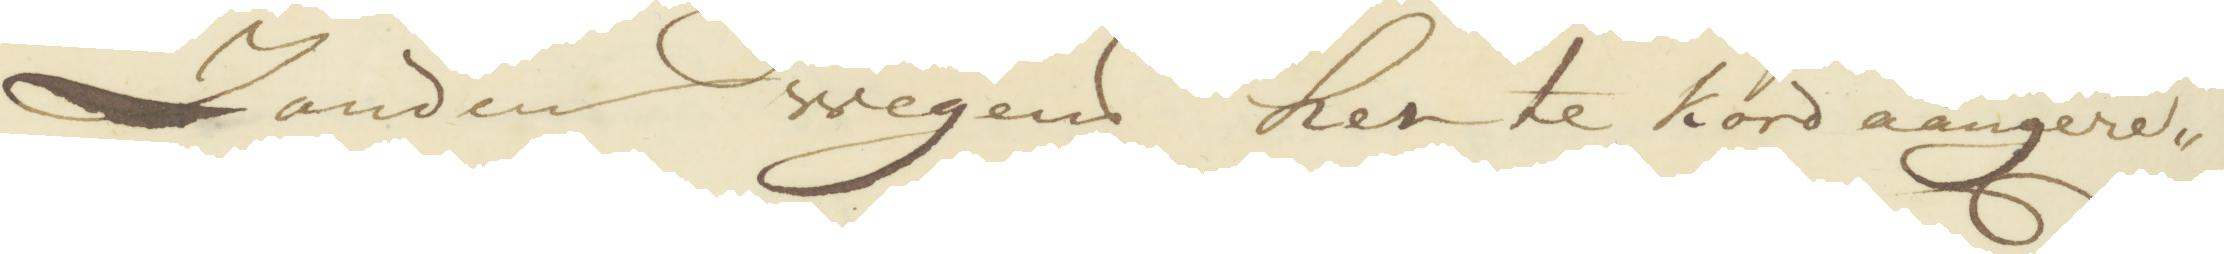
zonden wegens het te kord aangere„
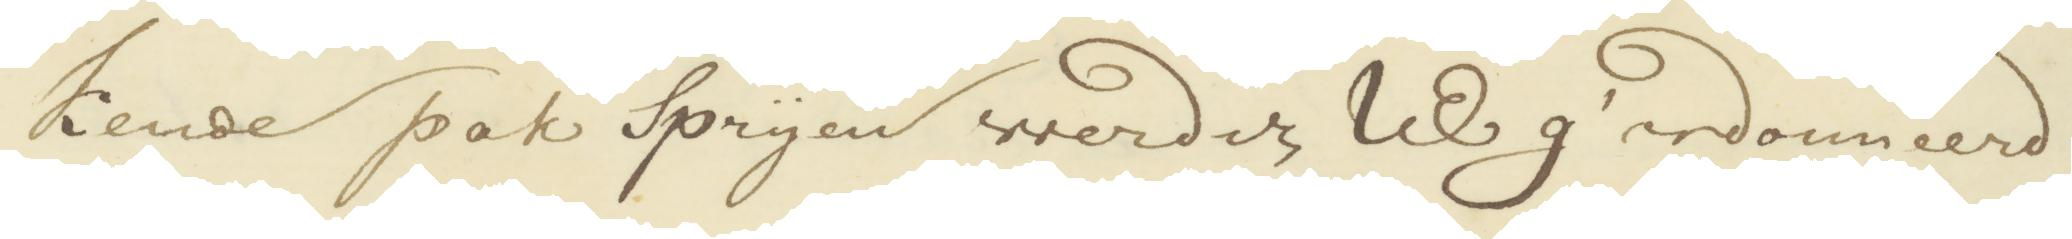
kende pak sprijen werden UE g'ordonneerd
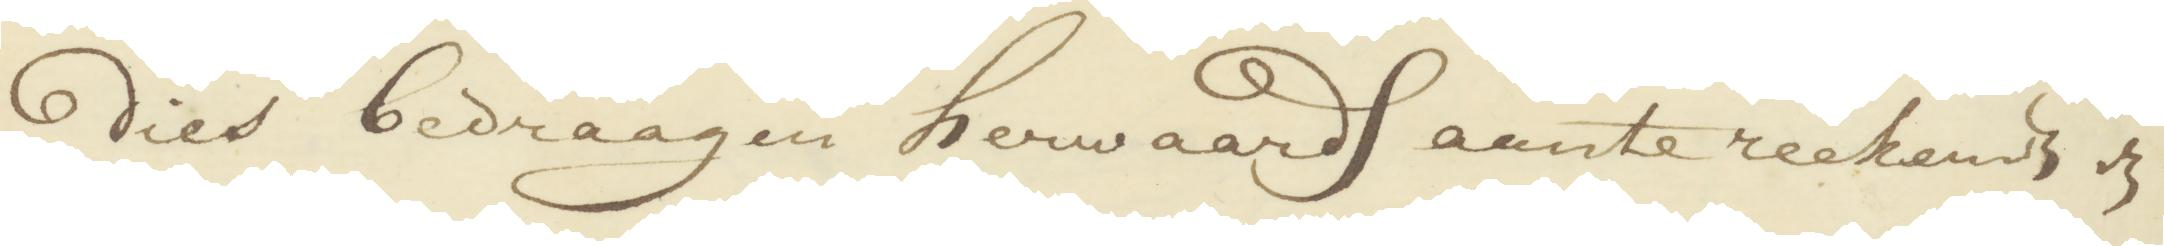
dies bedraagen herwaards aante reekenen en
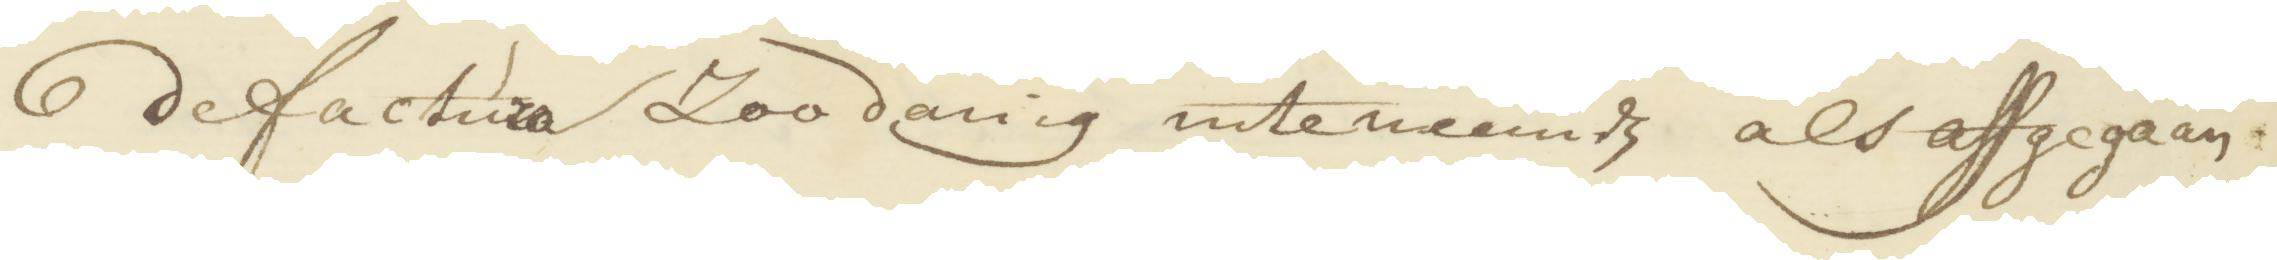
de factura zoodanig inteneemen als affgegaan
